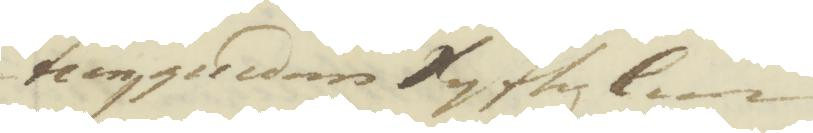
tien guldens Vyftig Cent
